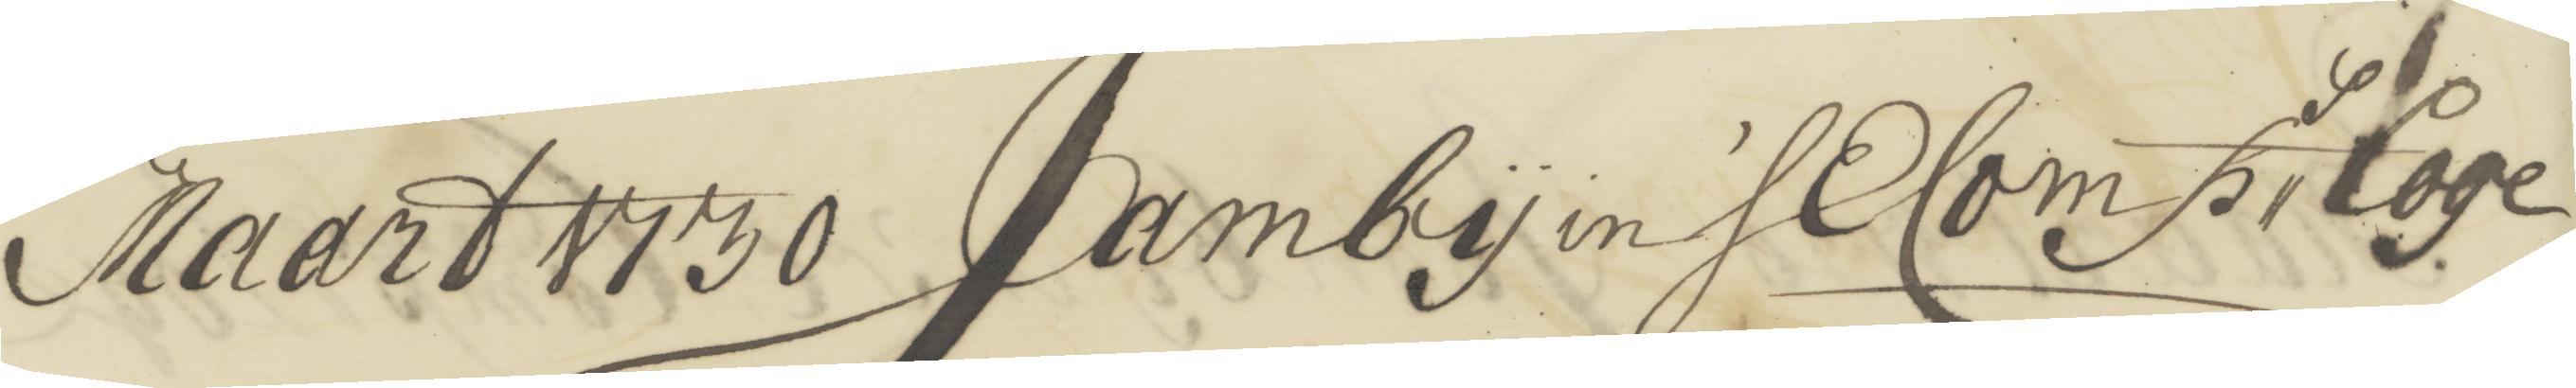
Maart 1730 Jambij in 'sE Comp„s Loge
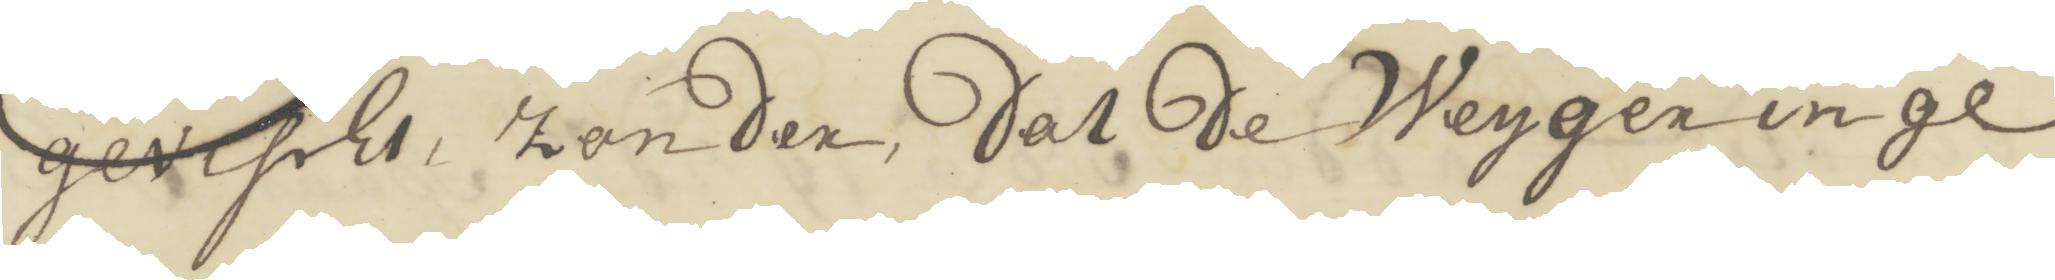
gevescht, zonder, dat de Weygeringe
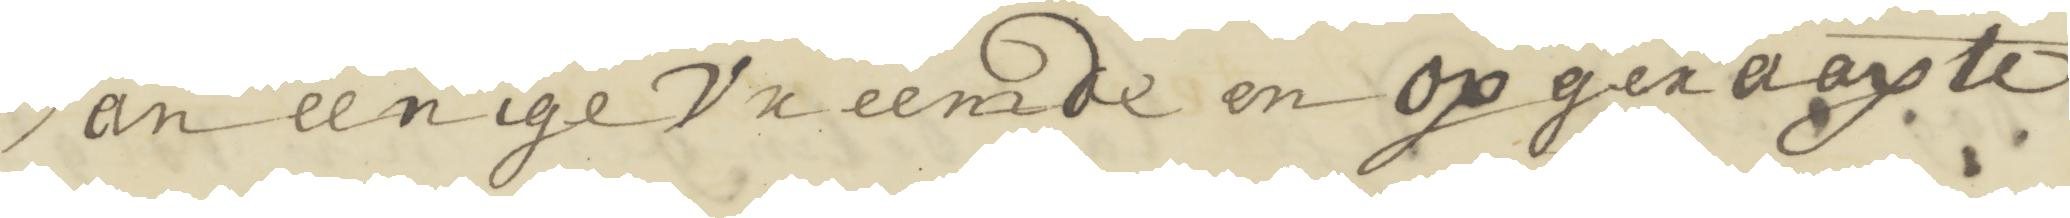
van eenige vreemde en opgeraapte
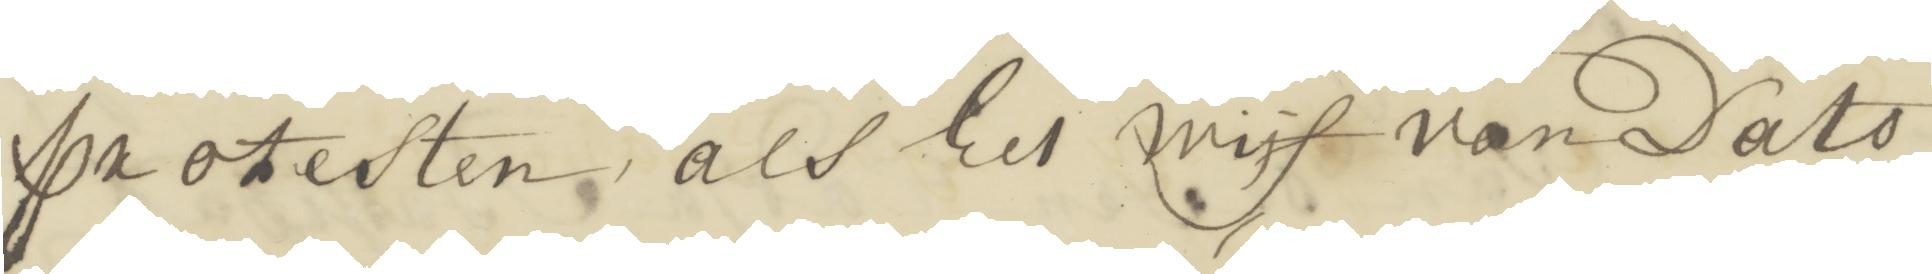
protesten, als het wijf van Dato
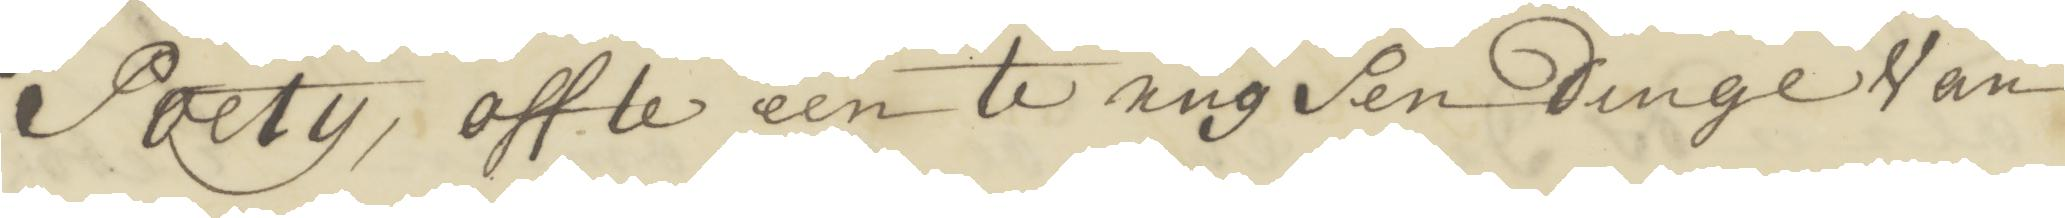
Poety, offte een te rug sendinge van
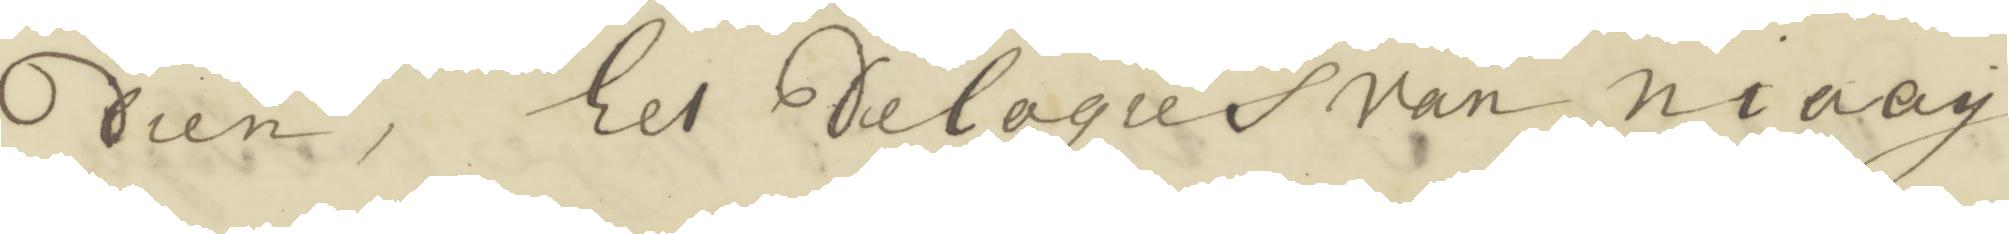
dien, het delogies van niaaij
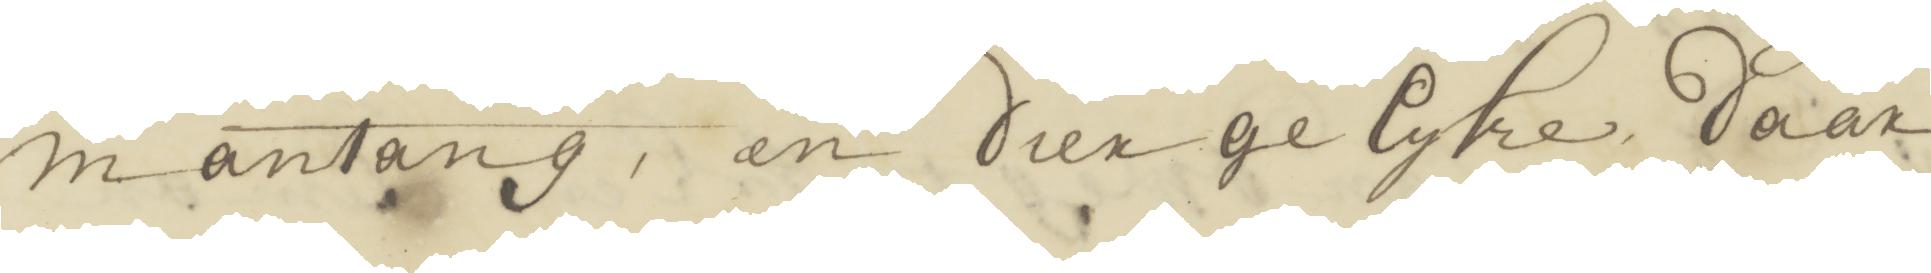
mantang, en dier gelyke daar
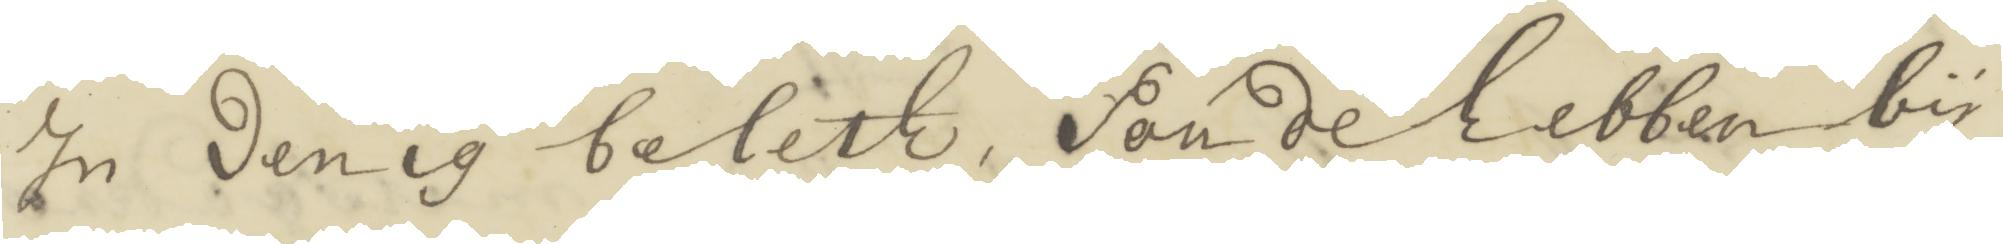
in den 19 beleth, soude hebben bij
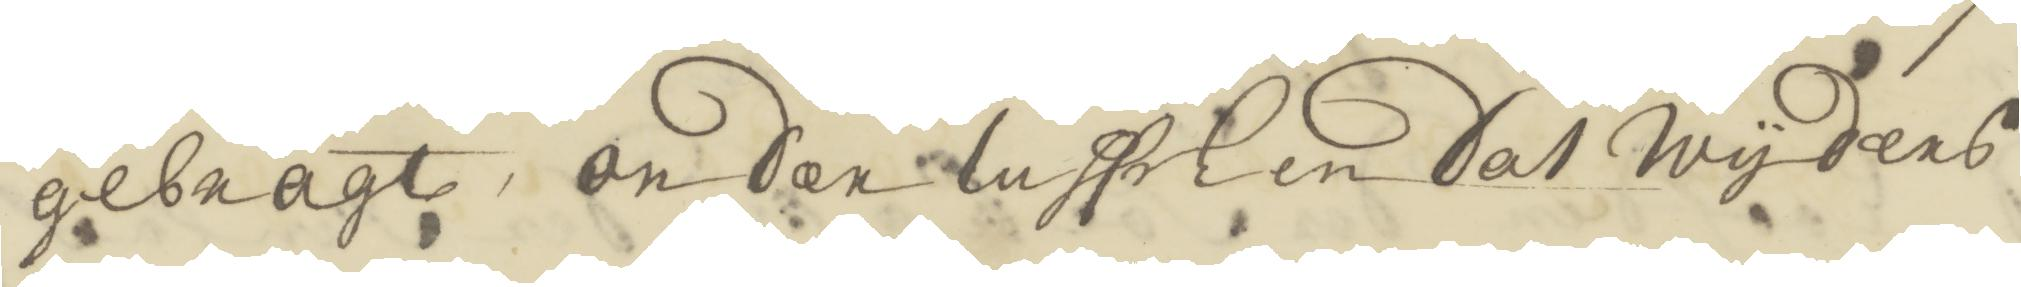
gebragt, onder tusschen dat wijders
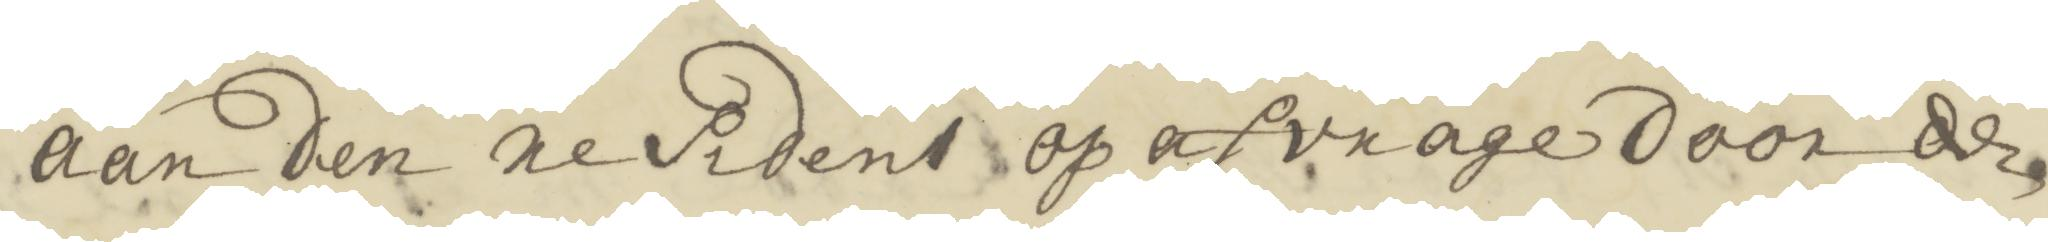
aan den resident op afvrage door den
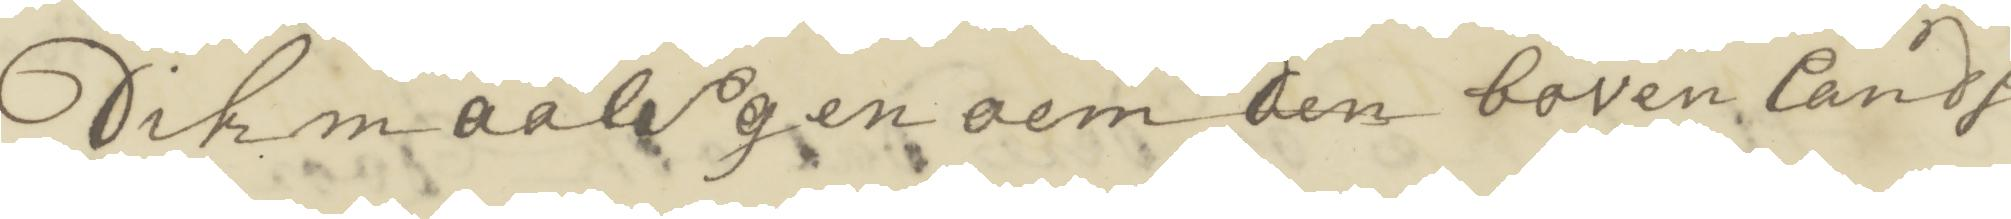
dikmaals genoemden boven lands
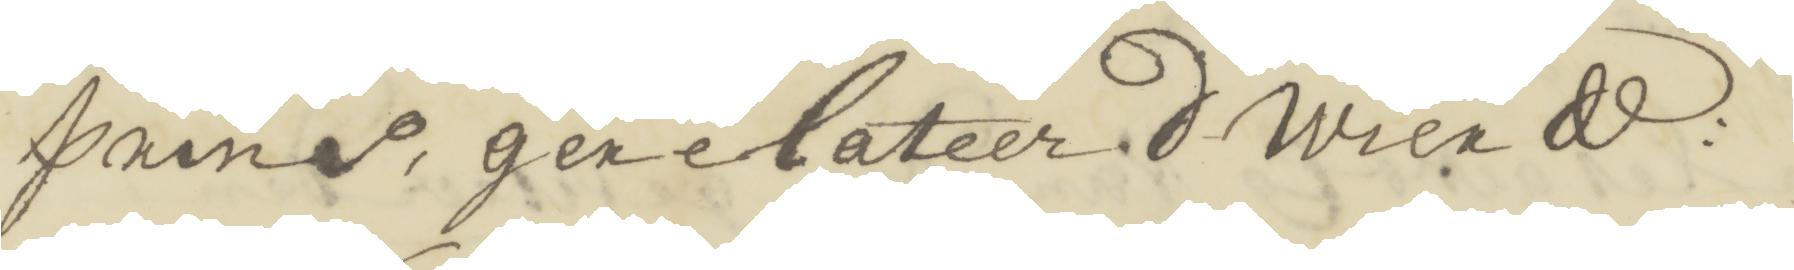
prins, gerelateerd wierde:
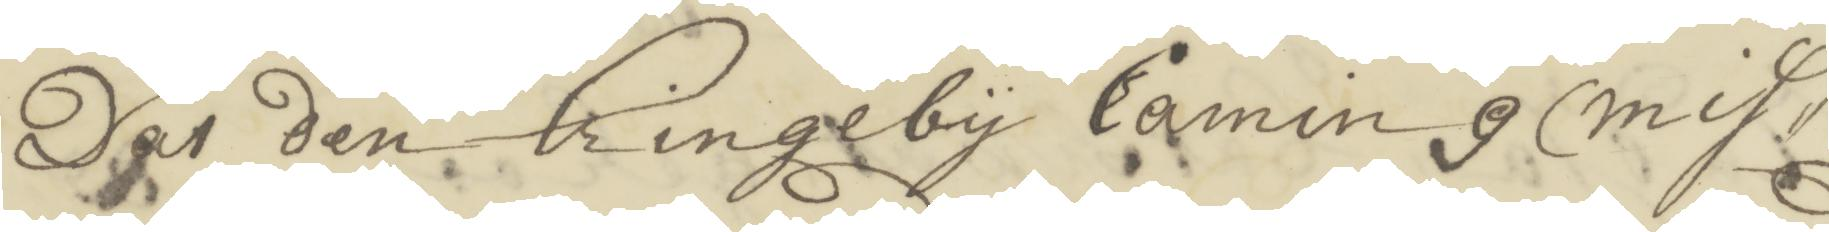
Dat den kingebij Camin 9 (mis„
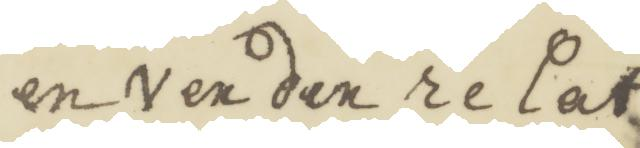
en verder relat
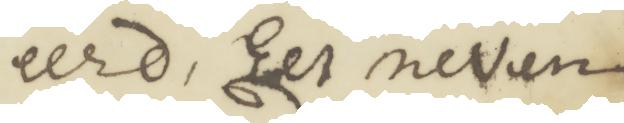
eerd, het neven
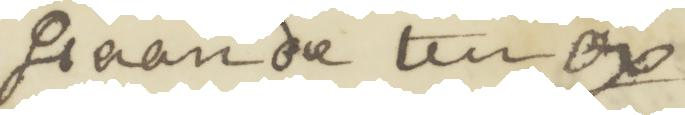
staande ten op
